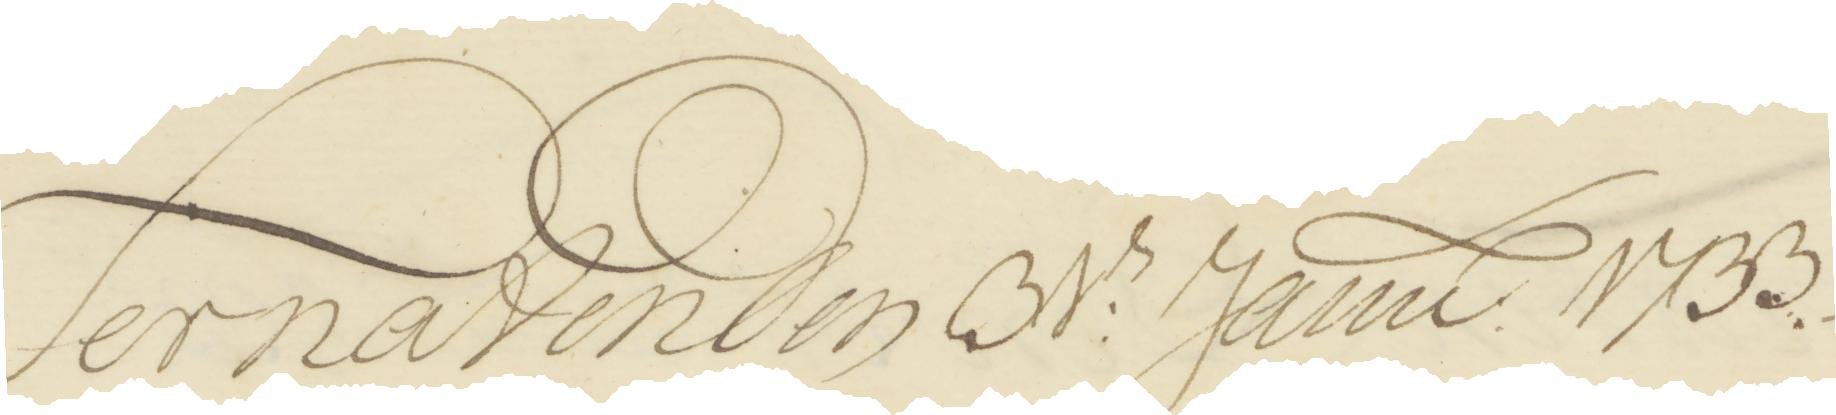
Ternaten den 31:en Janu: 1733.
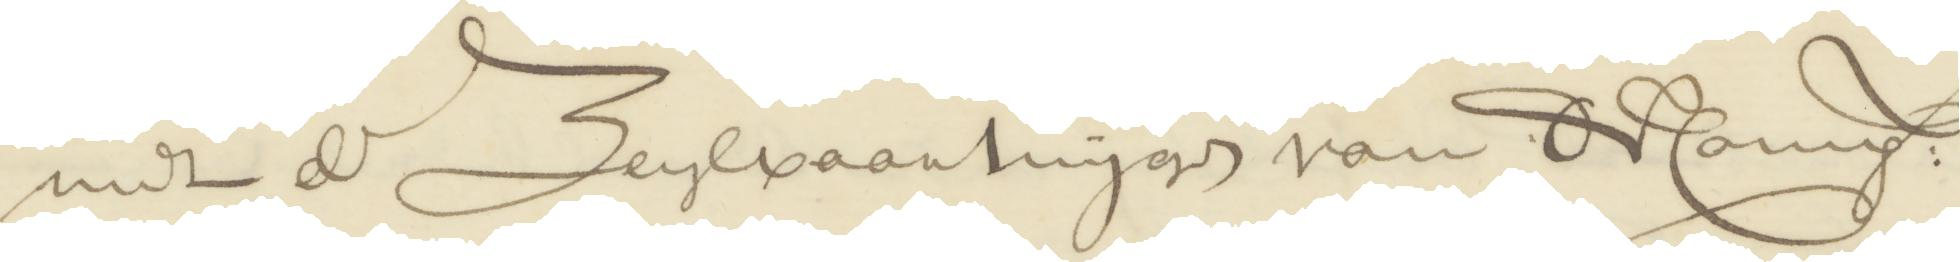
met de zeylvaartuijgen van d EComp:
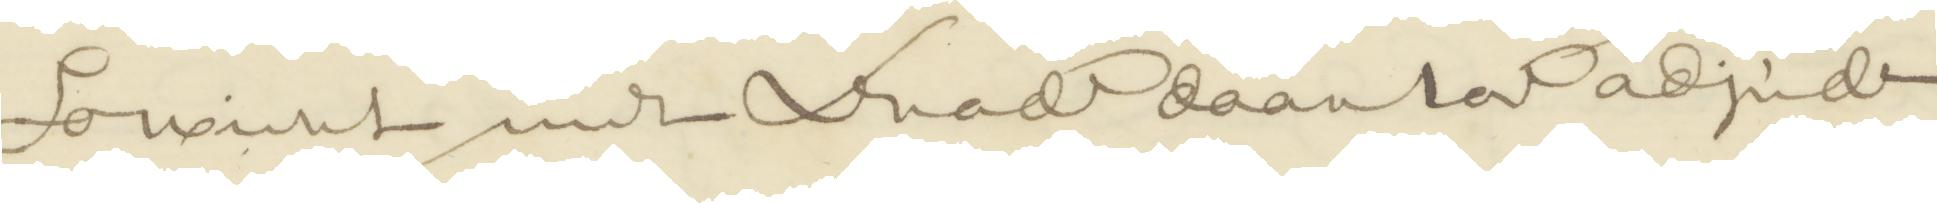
sowiert met te rade daar toe adjude
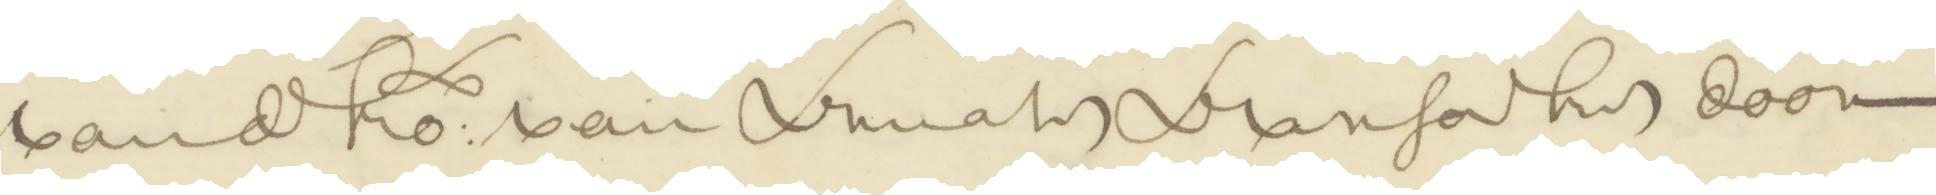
van de ko: van Ternaten Te versoeken door
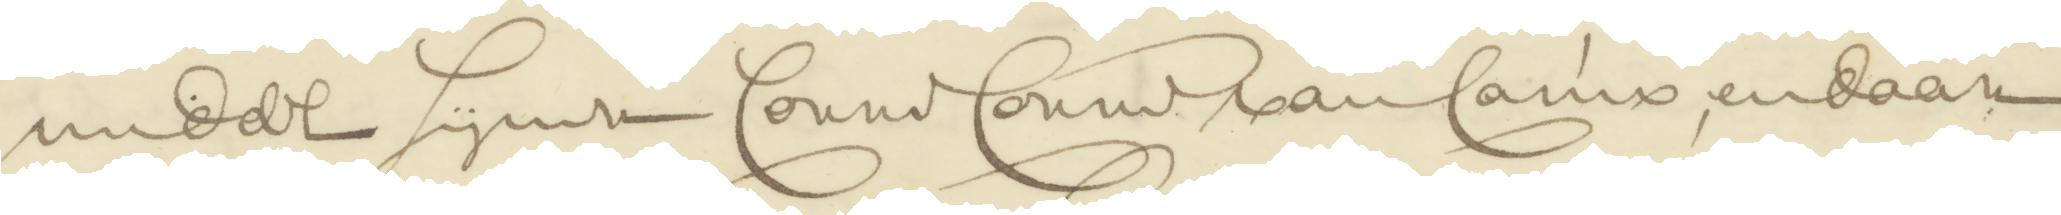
middel sijner corne corne van Cauw, en daar
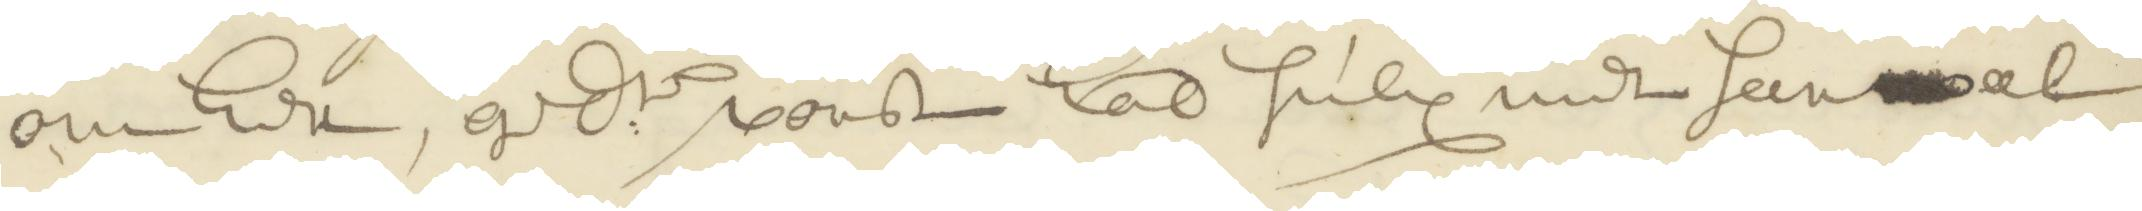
om her, ged:te vorst had sulx met seer veel
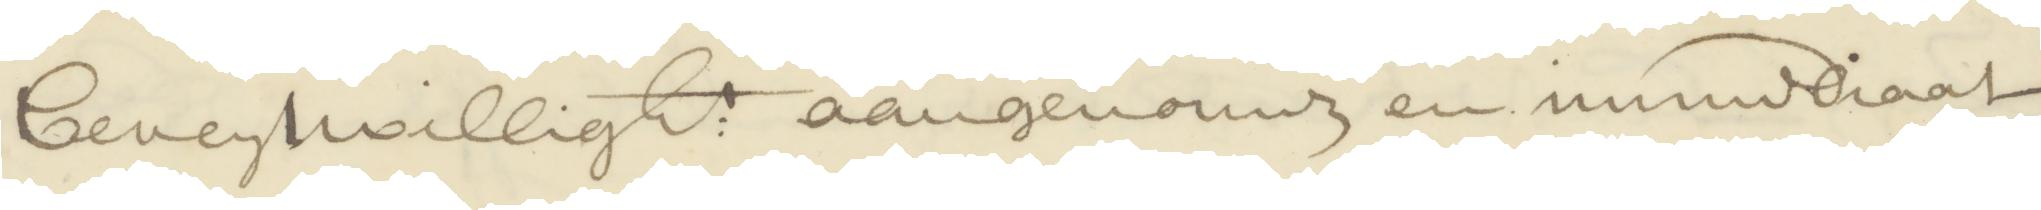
bereytwilligh:t aangenomen en immediaat
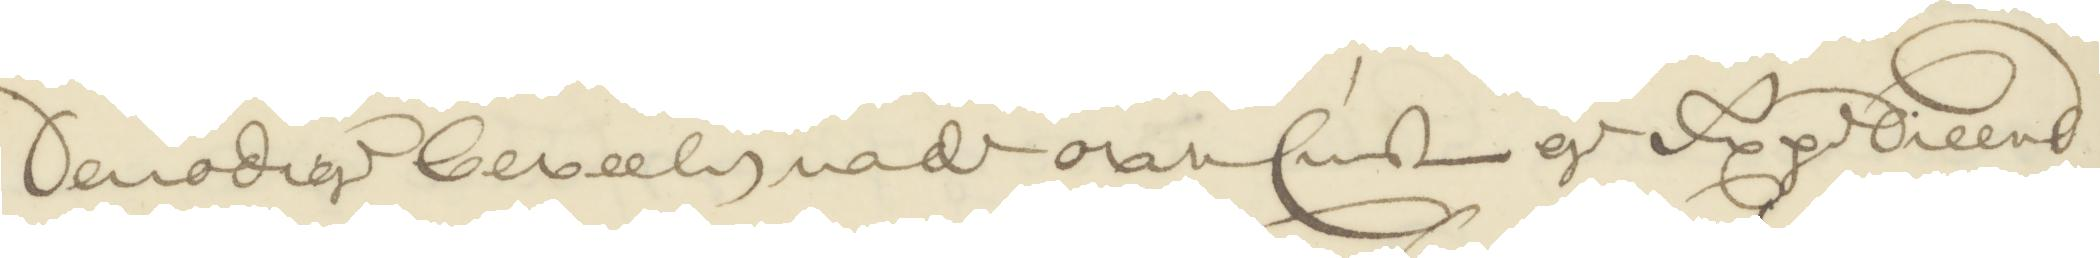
de nodige beveelen na de over cust geExperdieerd
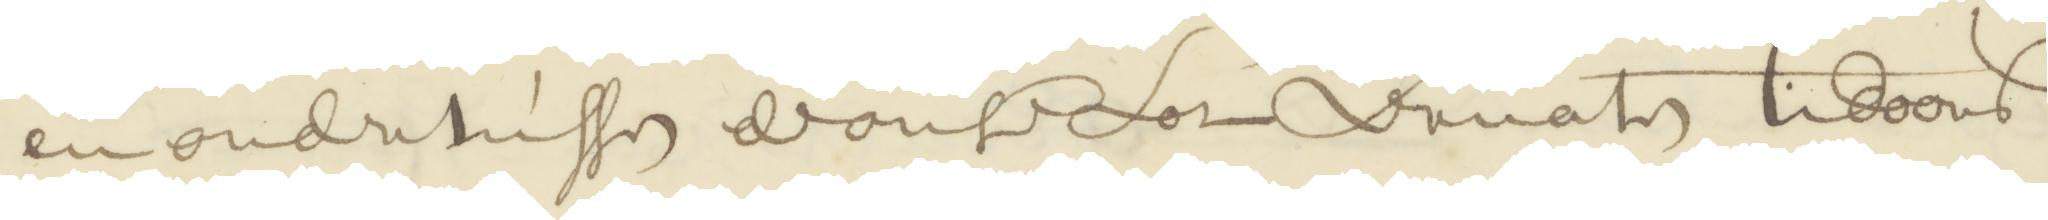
en ondertussen de onse Tot Ternaten Tidoors
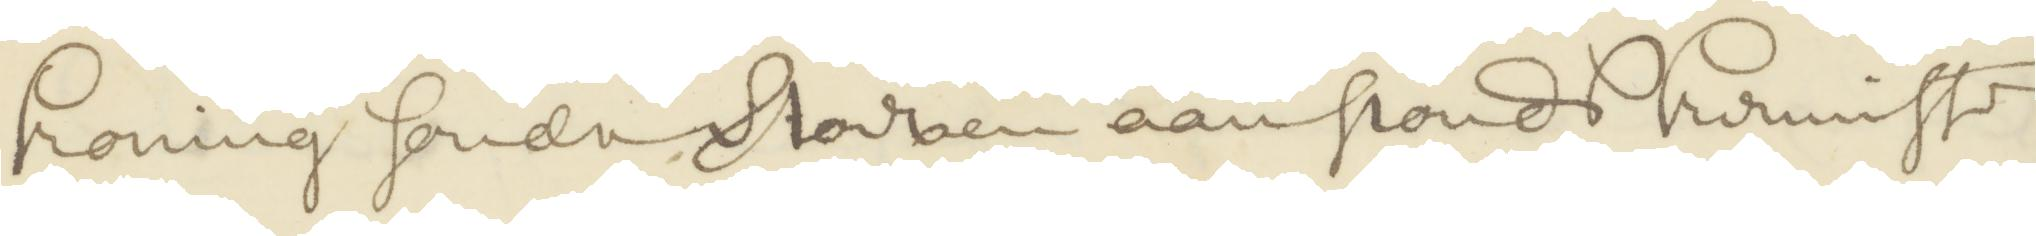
koning sonder vertoeven aanstonds kennisse
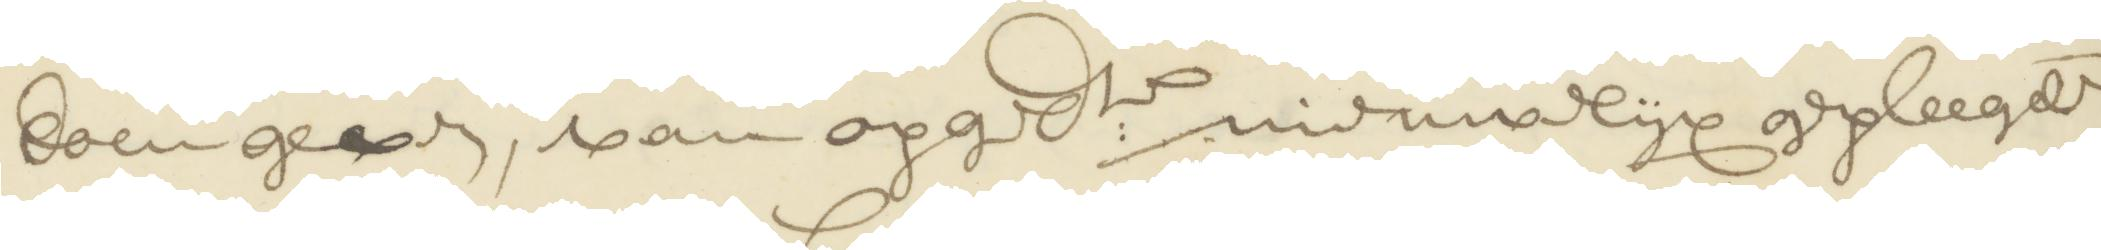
doen geven, van opgel:te nieuwelijx gepleegde
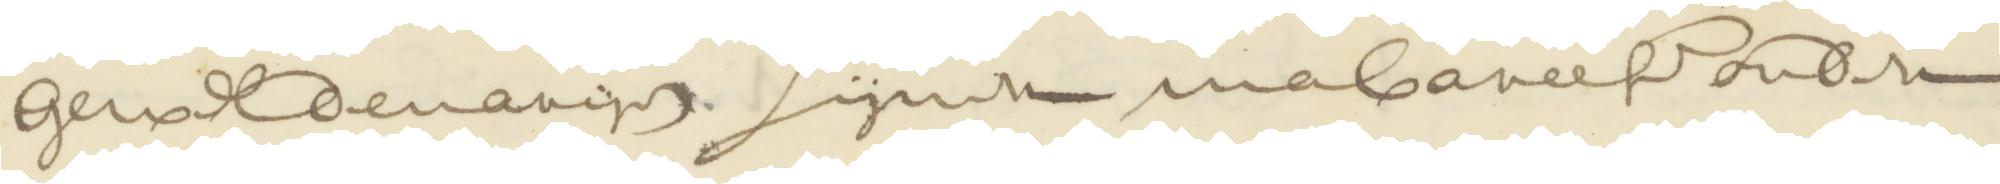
geweldenarijen Sijner mabareese onder
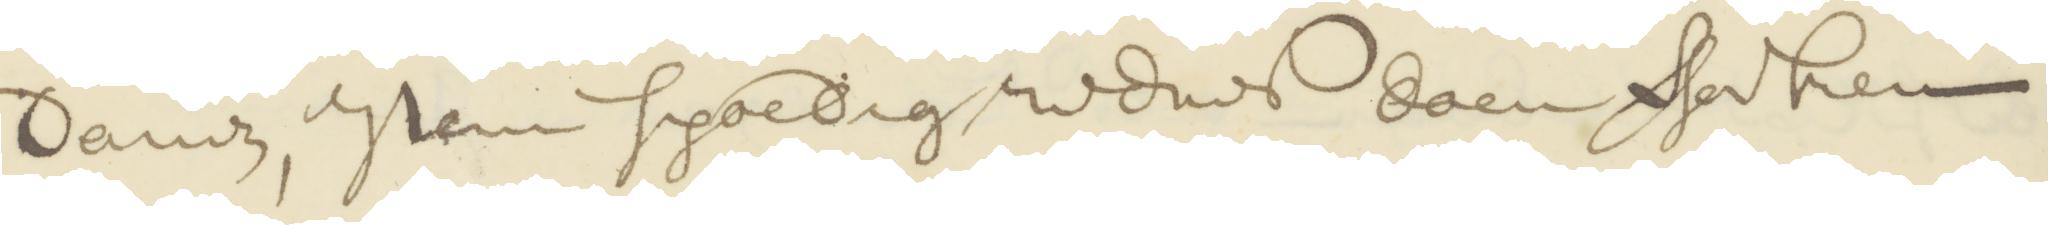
danen, Jtem spoedig redres doen versoeken
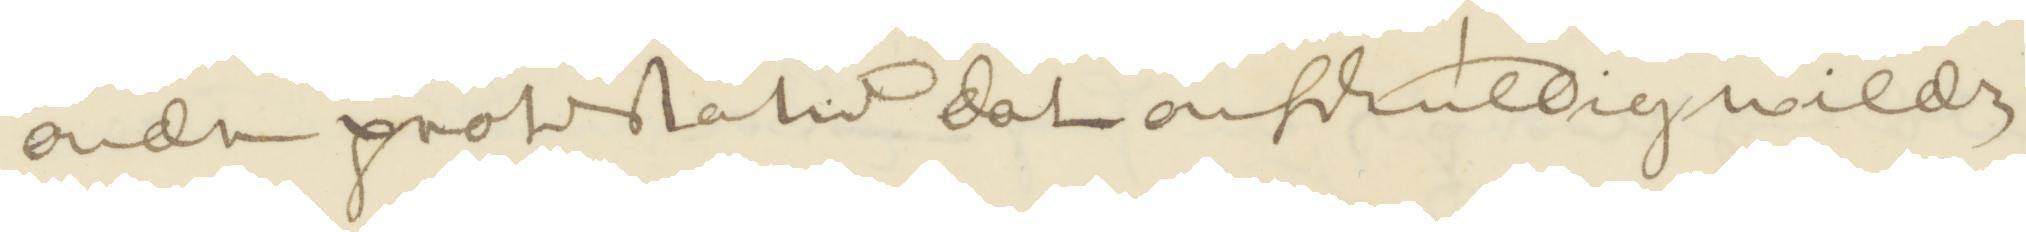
onder protestatie dat onschuldig wilden
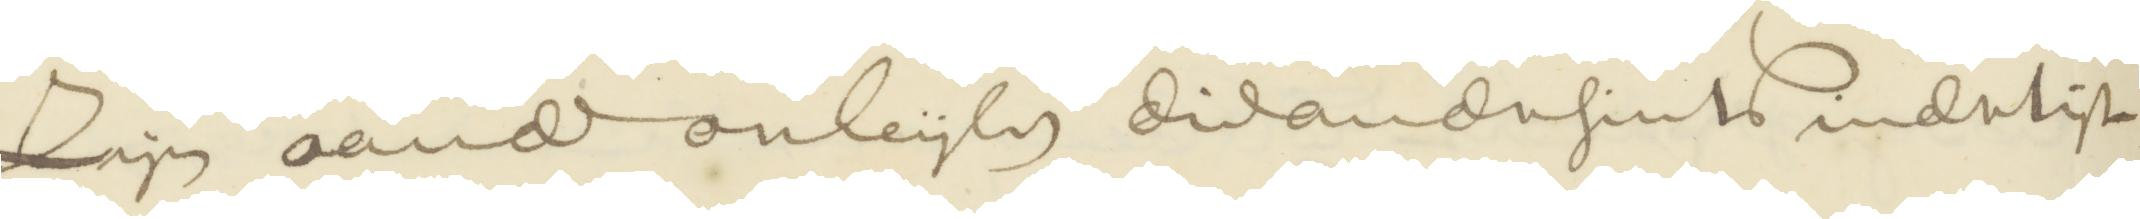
Zijn aan de onheijlen die andersints indertijt
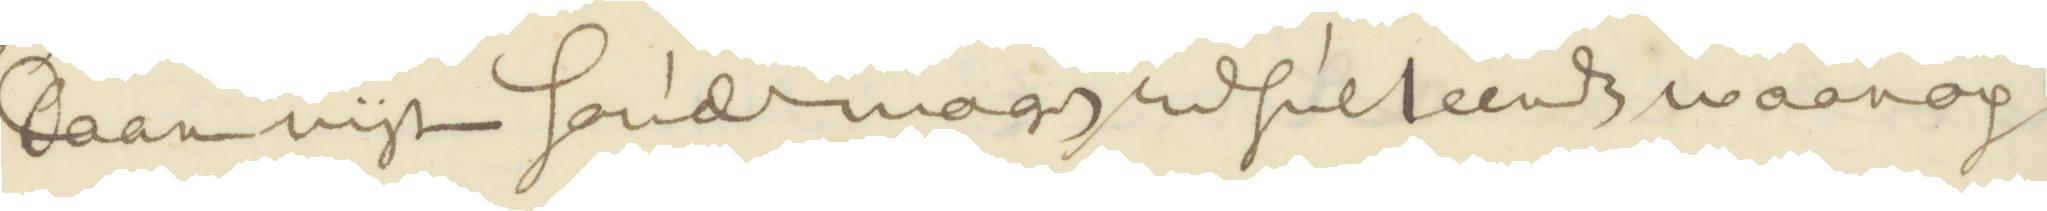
daar uijt Soude mogen resulteeren waarop
